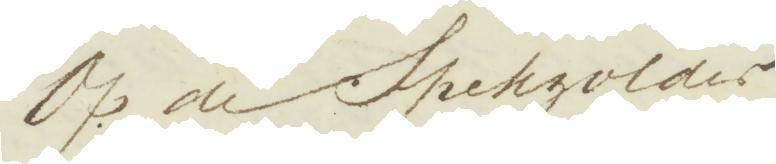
Op de Spekzolder
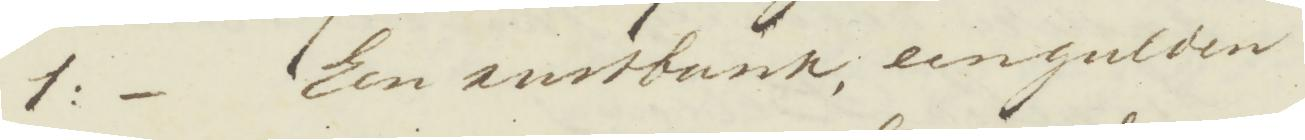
1: — Een rustbank, een gulden
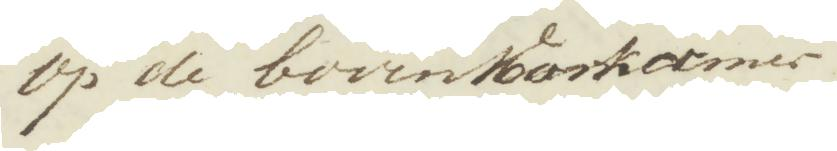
op de bovenwaskamer
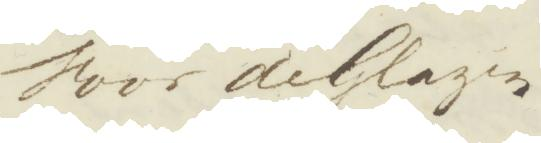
Voor de Glazen
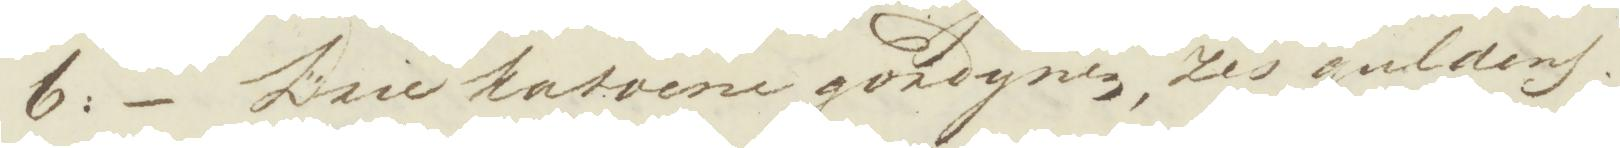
6: — Drie katoene gordynen, zes guldens.
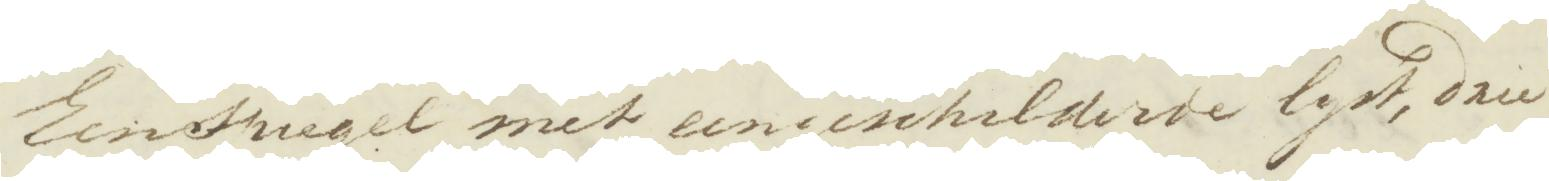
Een spiegel met een geschilderde lyst, drie
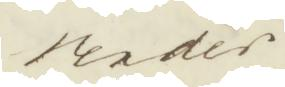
verder
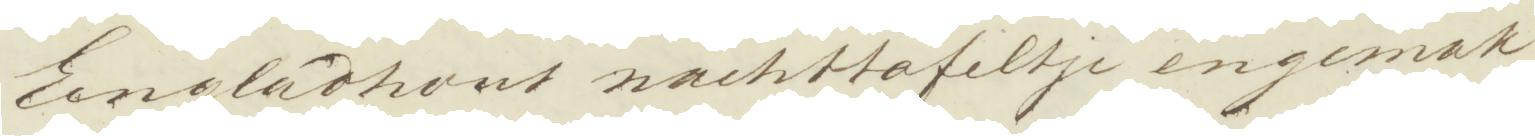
Een gladhout nachttafeltje en gemak
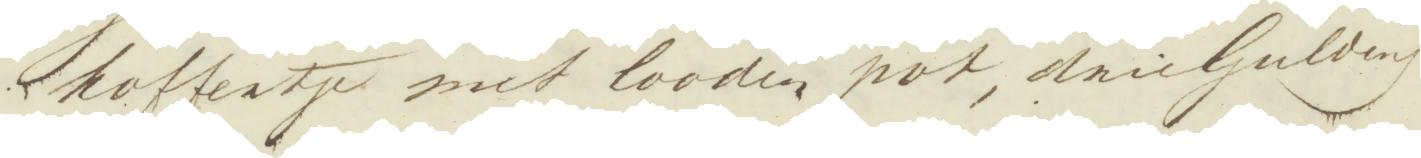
koffertje met looden pot, drie Guldens
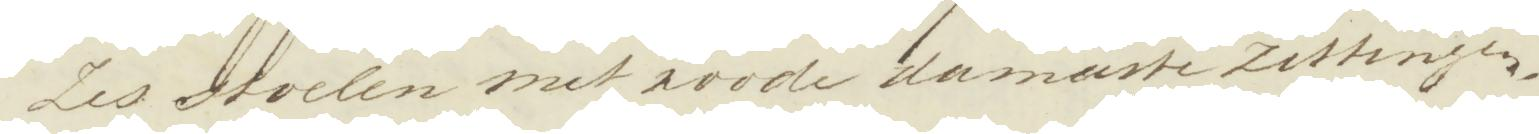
Zes stoelen met roode damaste zittingen,
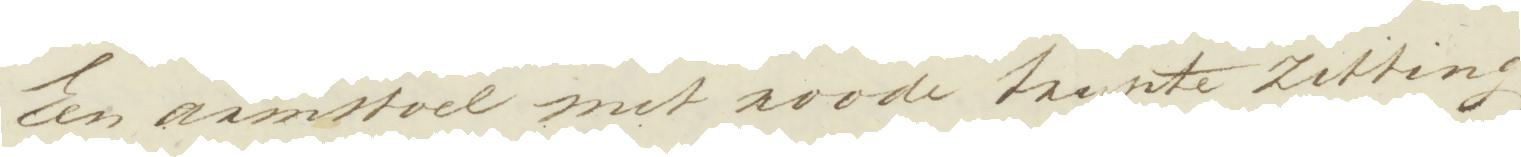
Een armstoel met roode trypte zitting
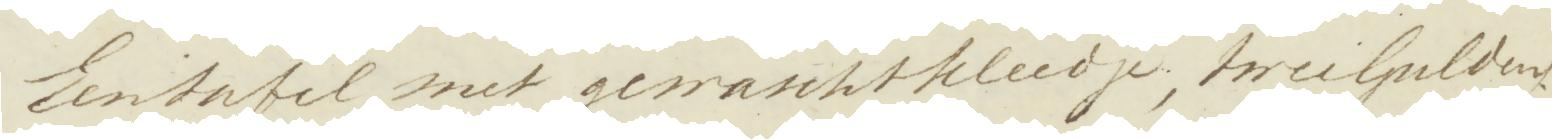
Een tafel met gewascht kleedje, twee Guldens
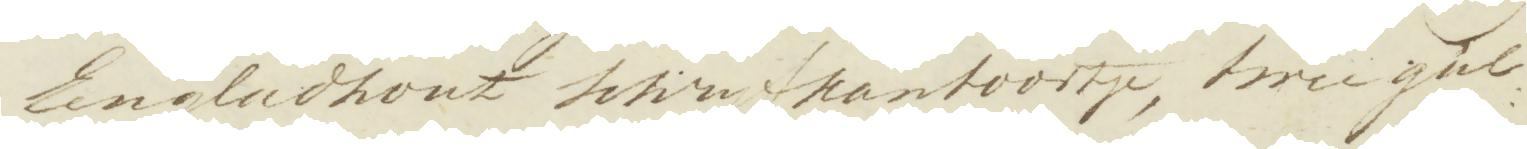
Een gladhout schryfkantoortje, twee gul„
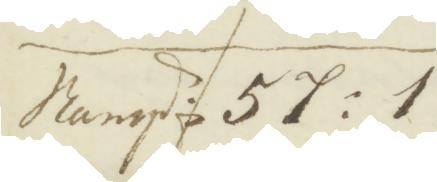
Transp.t ƒ 57: 1
